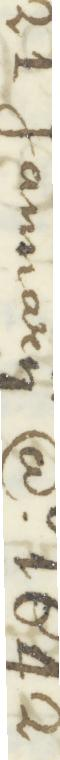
21 Januarij @.o 1642
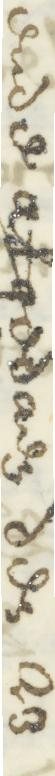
ende afgedaen den 23
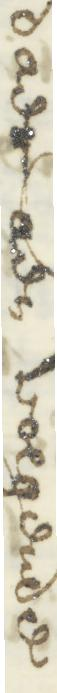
daer aen volgende
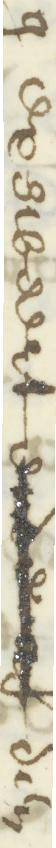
g'exhibeert ende af den
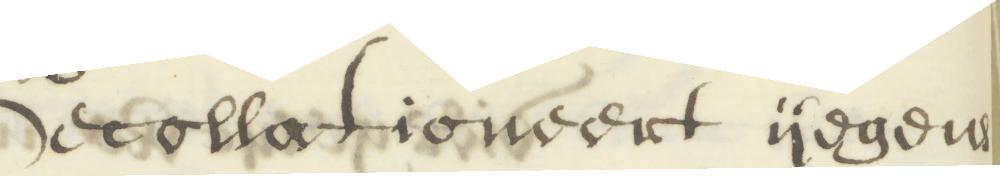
Gecollationeert ijegens
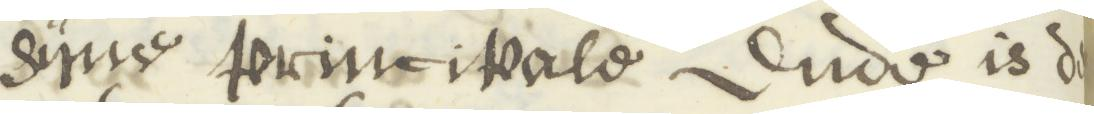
sijne principale ende is de
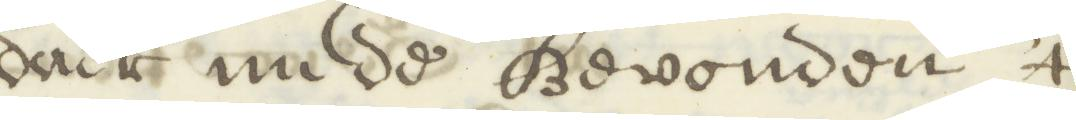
daer mede Bevonden 't
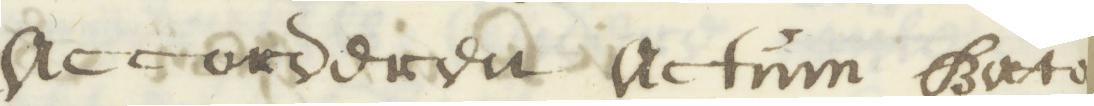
accorderen actum Bat
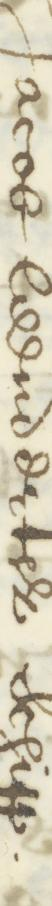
Jacob leendertsz schipp.r
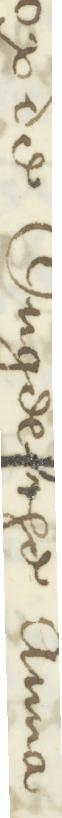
op de Engelsche Anna
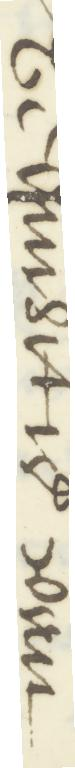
requisitie van
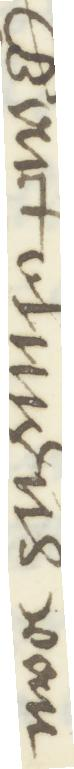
Bartolmeus van
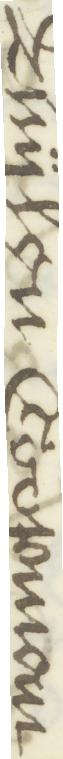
zuijlen Coopman
